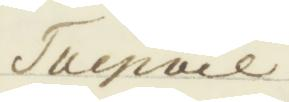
Toepoel
